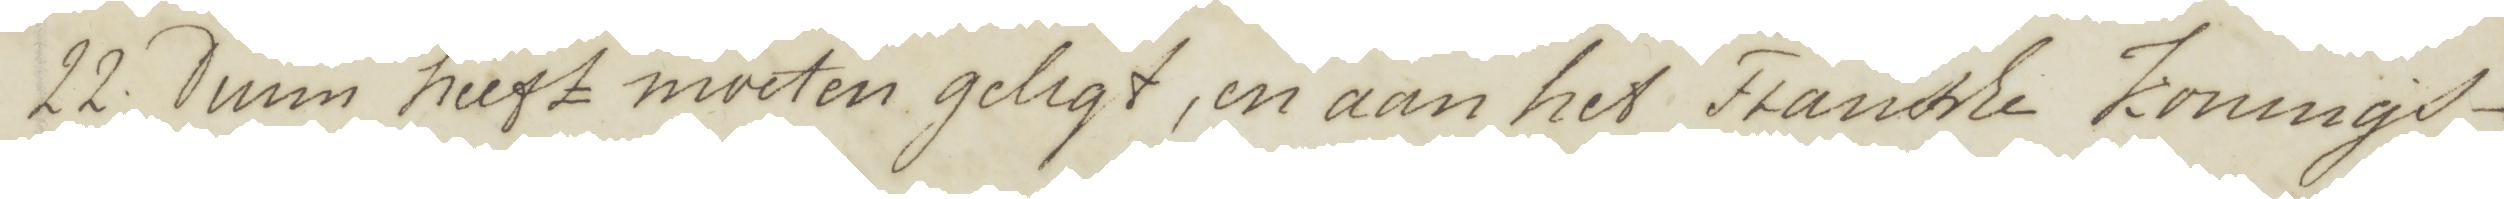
22. duim heeft moeten geligt, en aan het Fransche Konings¬
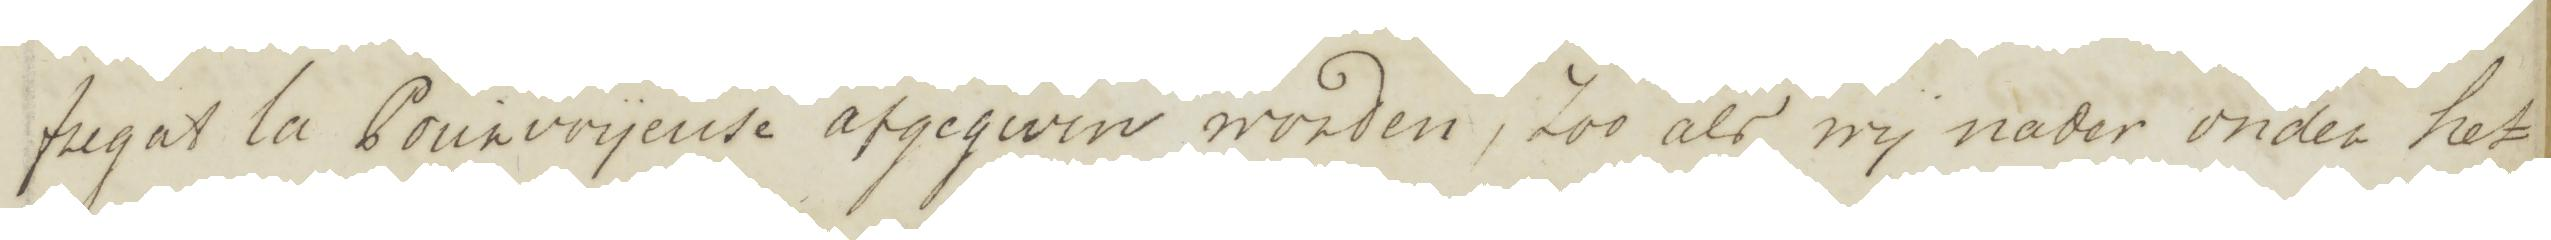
fregat la Pourvoijeuse afgegeven worden, zoo als wij nader onder het
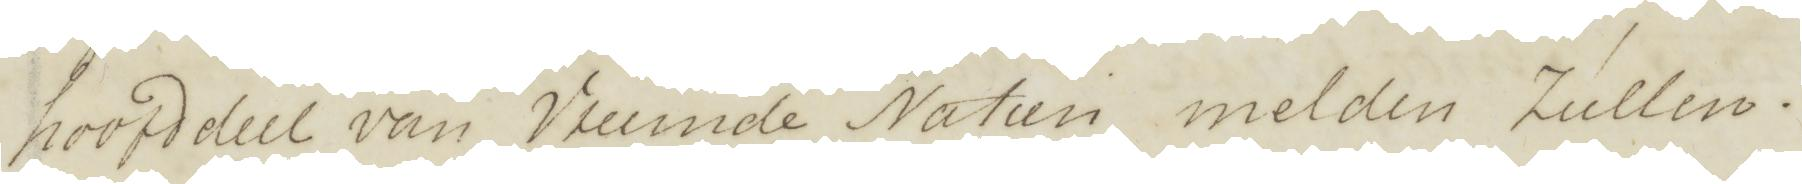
hoofd deel van Vreemde Natien melden zullen.
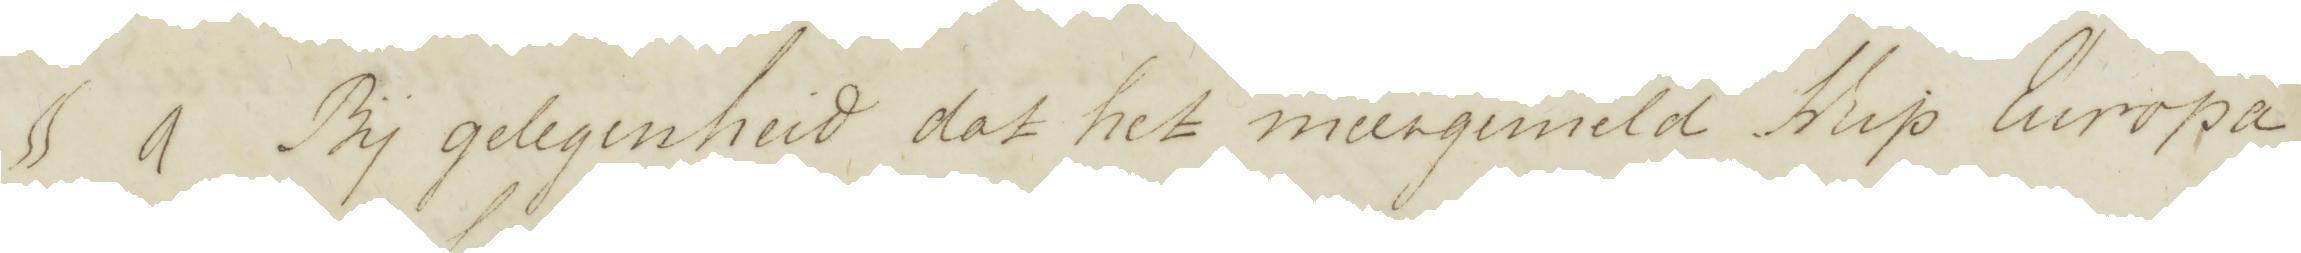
§ 4 Bij gelegenheid dat het meergemeld schip Europa
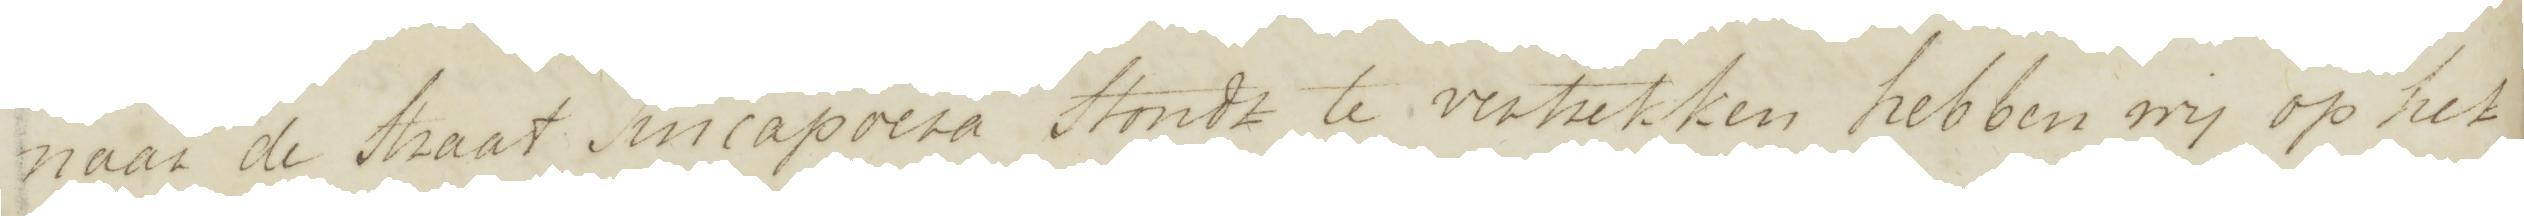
naar de straat Sincapoera stondt te vertrekken hebben wij op het
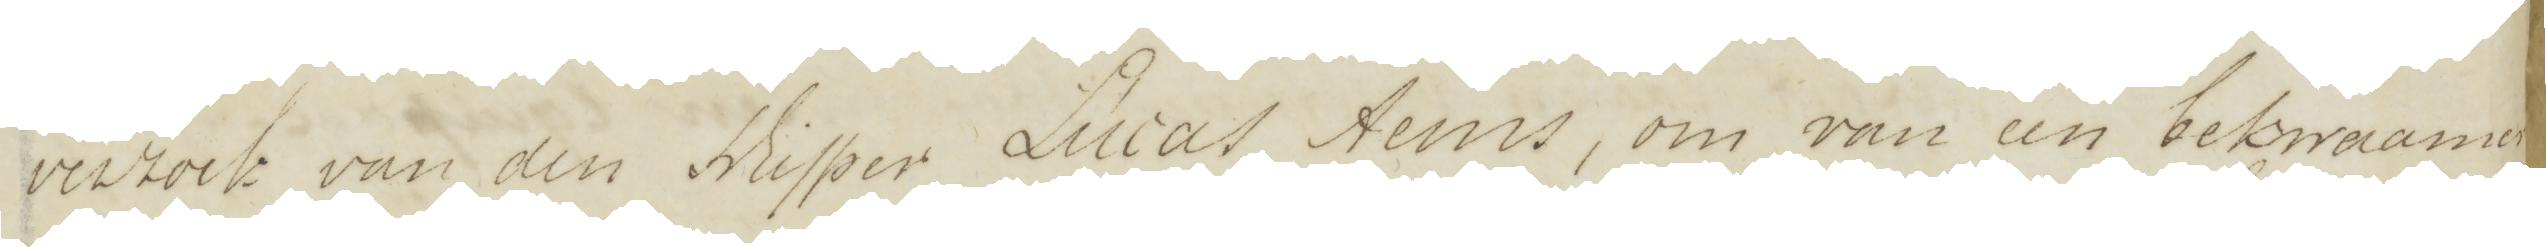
verzoek van den schipper Lucas Aems, om van een bekwaame
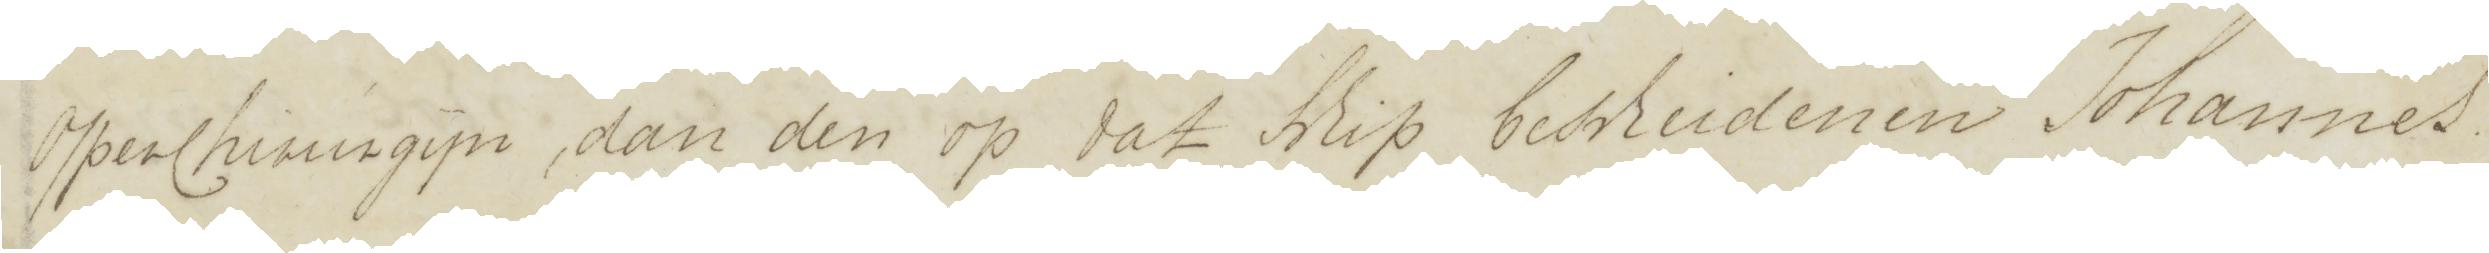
opperchirurgijn, dan den op dat schip bescheidenen Iohannes
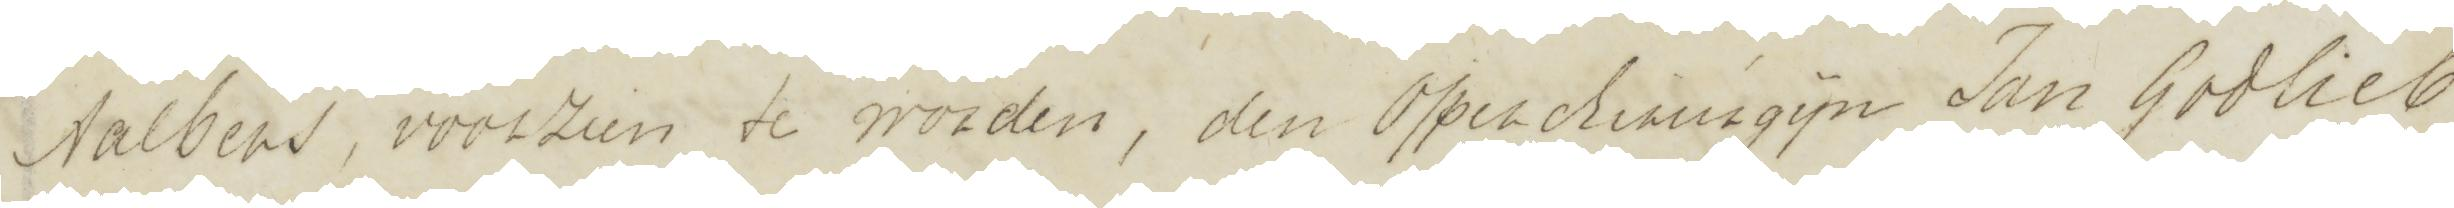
Aalbers, voorzien te worden, den opperchirurgijn Ian Godlieb
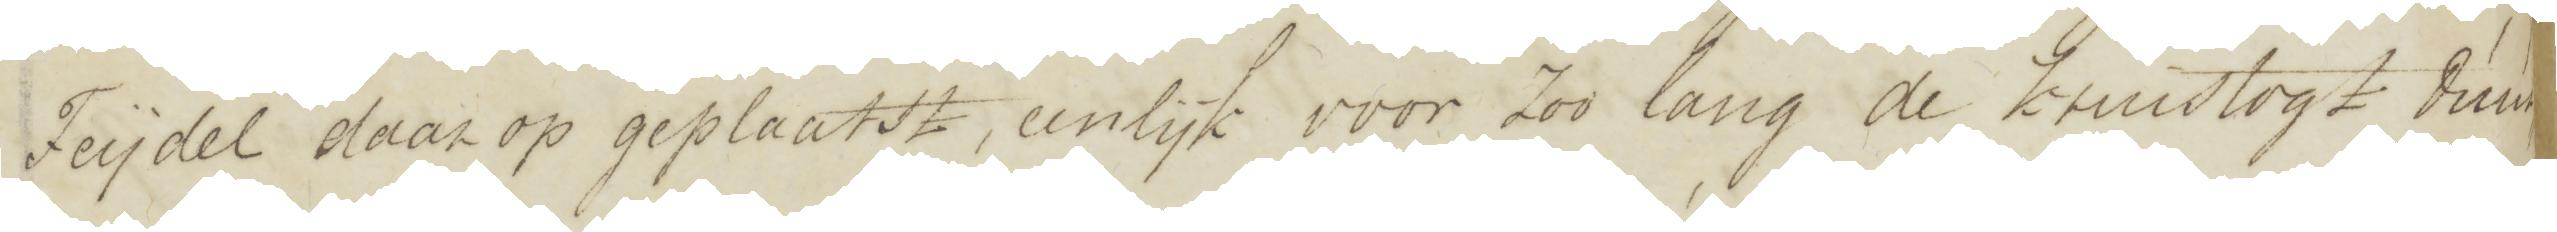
Feijdel daar op geplaatst, eenlijk voor zoo lang de kruistogt duu
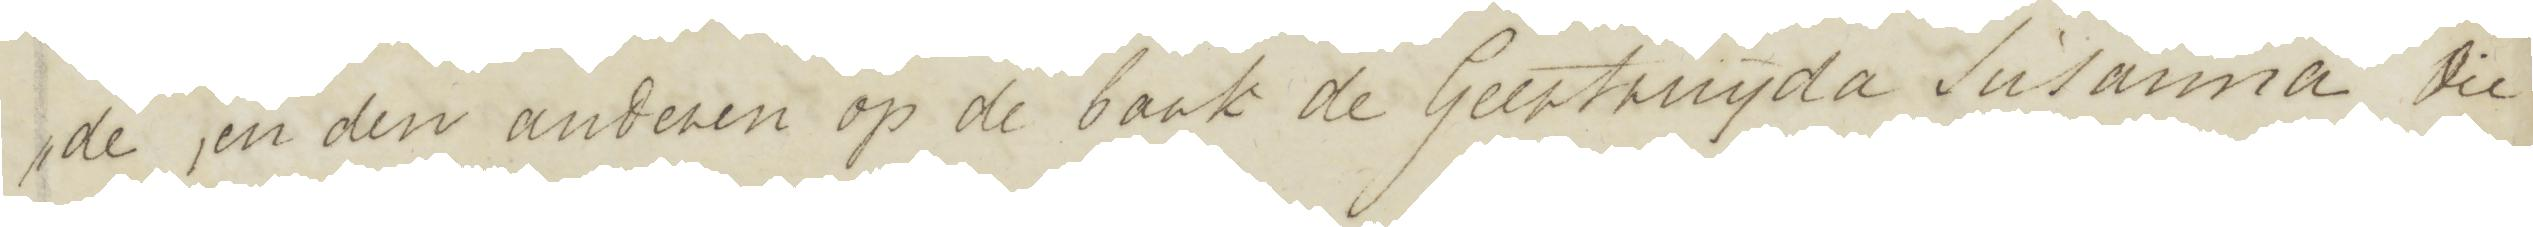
„de, en den anderen op de bark de Geertruijda Susanna die
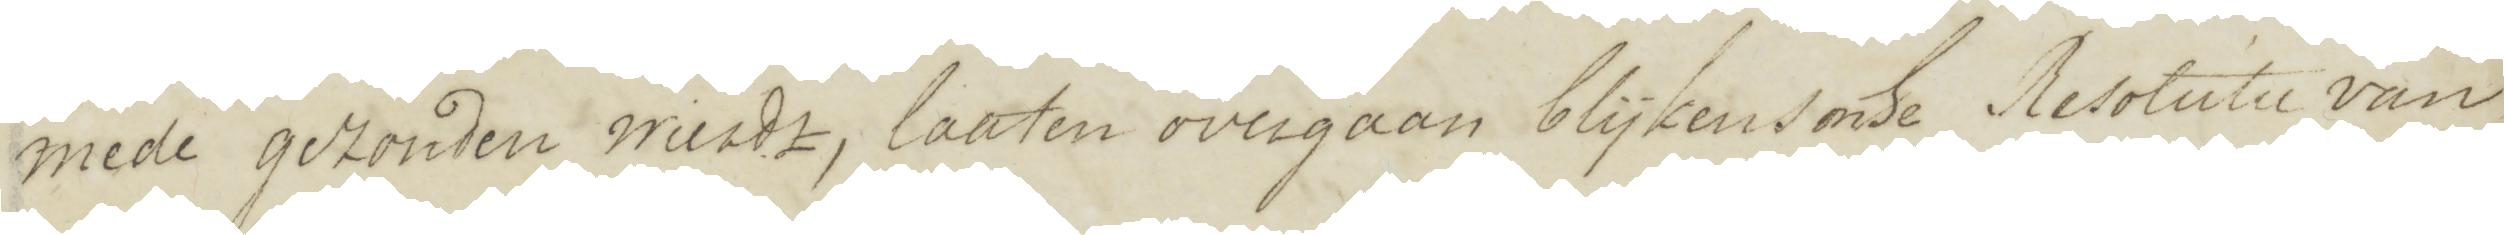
mede gezonden wierdt, laaten overgaan blijkens onse Resolutie van
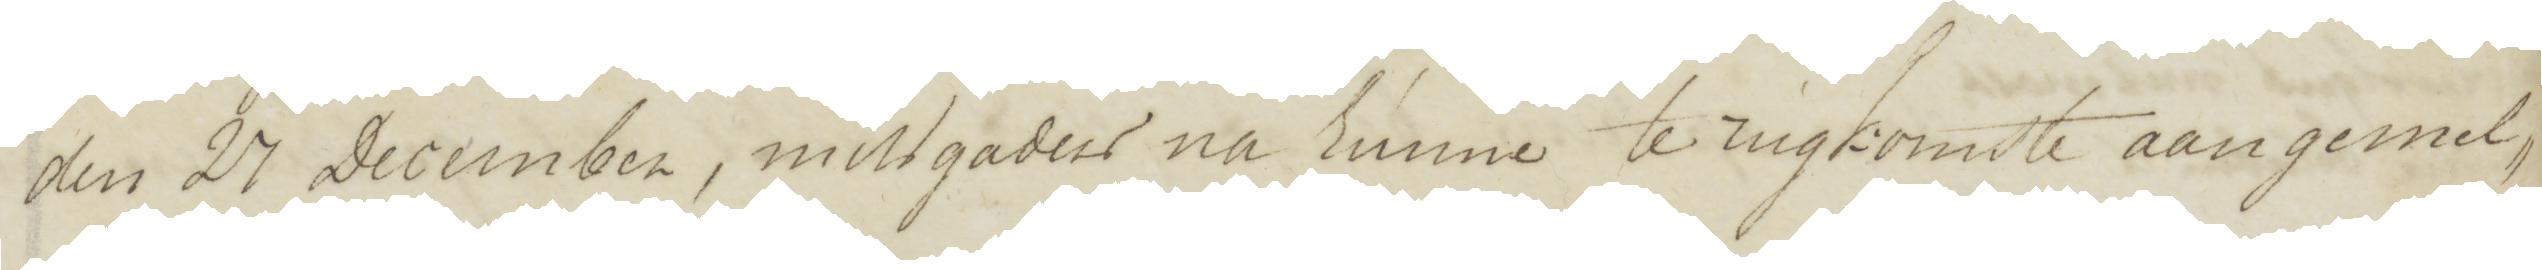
den 27 December, mitsgaders na hunne te rugkomste aan gemel„
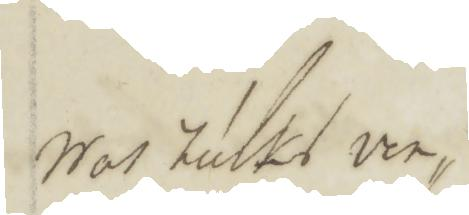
wat zulks ver„
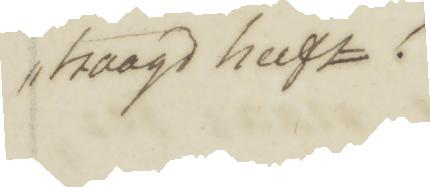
„traagd heeft!
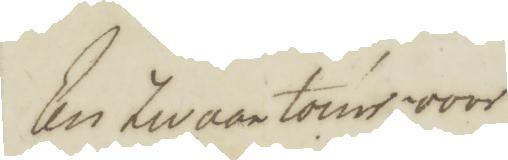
Een zwaar touw voor
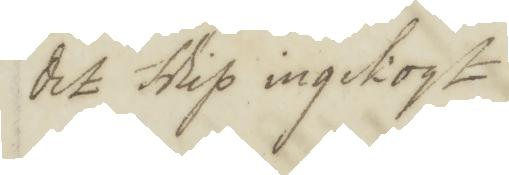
dit schip ingekogt
